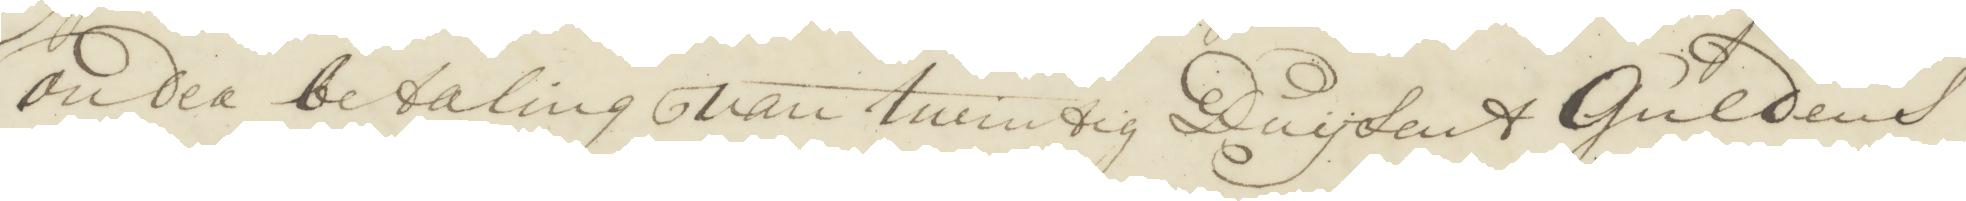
onder betaling van twintig Duijsent Guldens
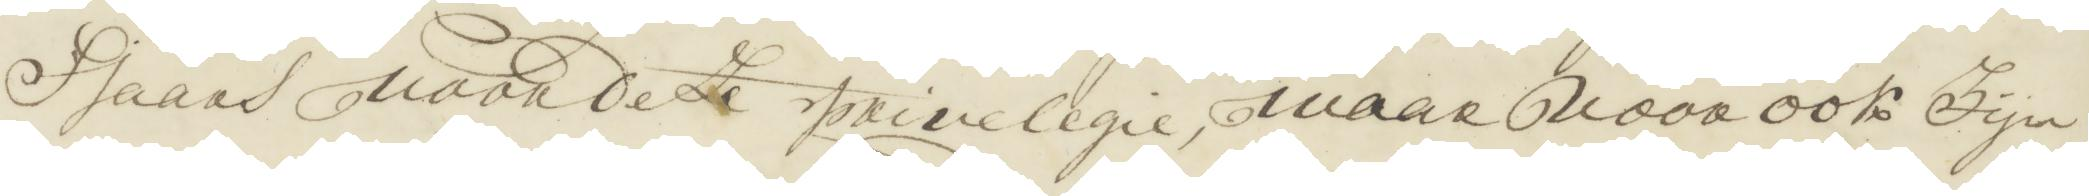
'sjaars voor deze privelegie, waar voor ook zijn
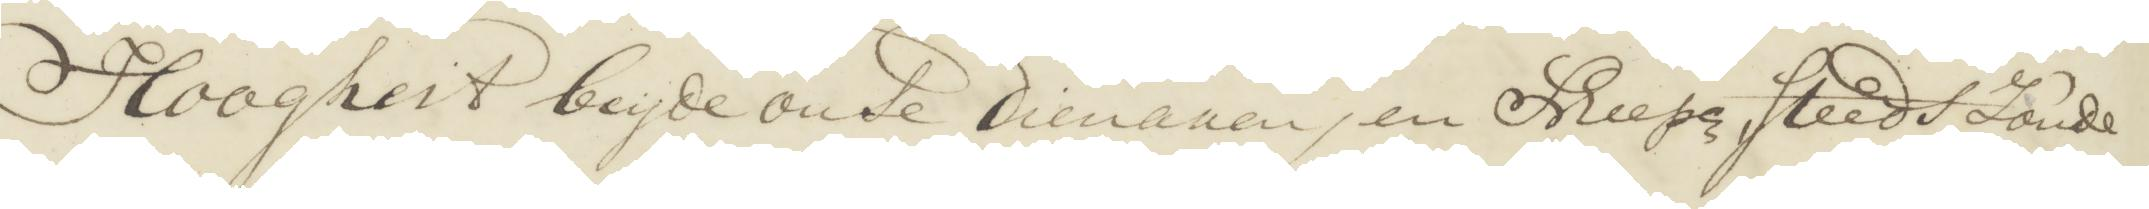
Hoogheit beijde onse dienaren, en scheepen, steeds zoude
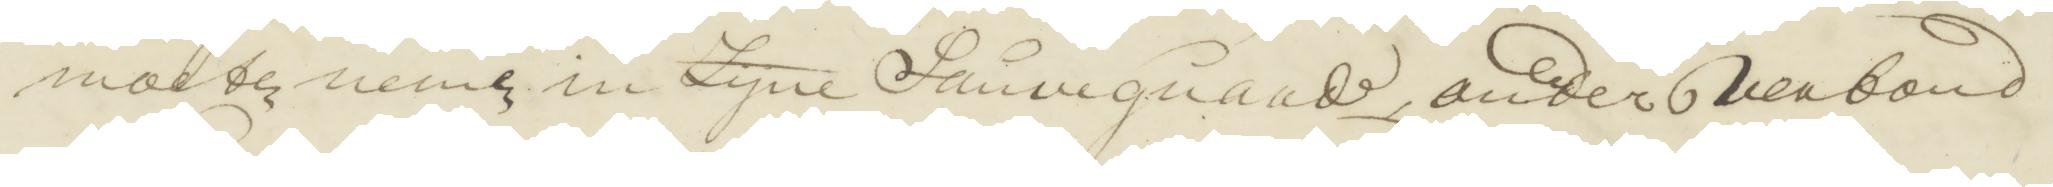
moeten nemen in zijne sauveguarde, onder verband
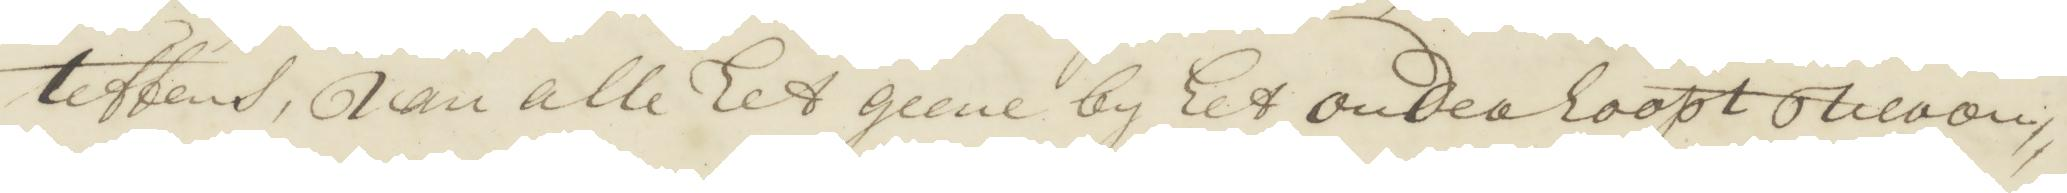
teffens, van alle het geene by het onderhoopt veron„
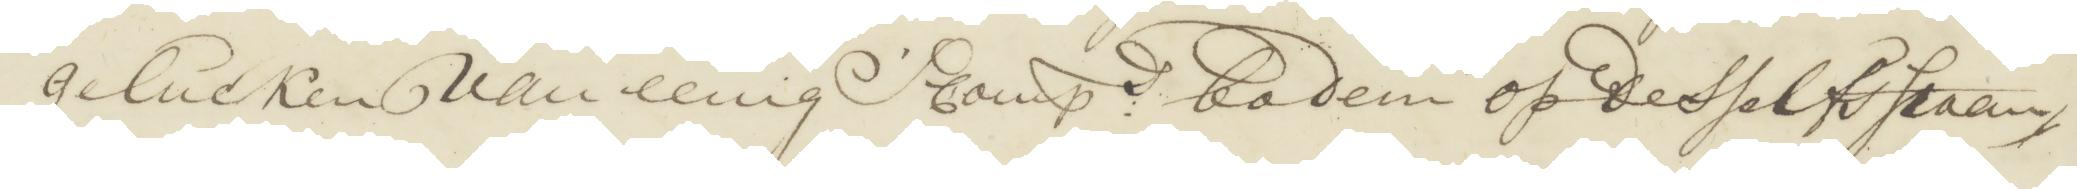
gelucken van eenig 's comp:s bodem op desself staan„
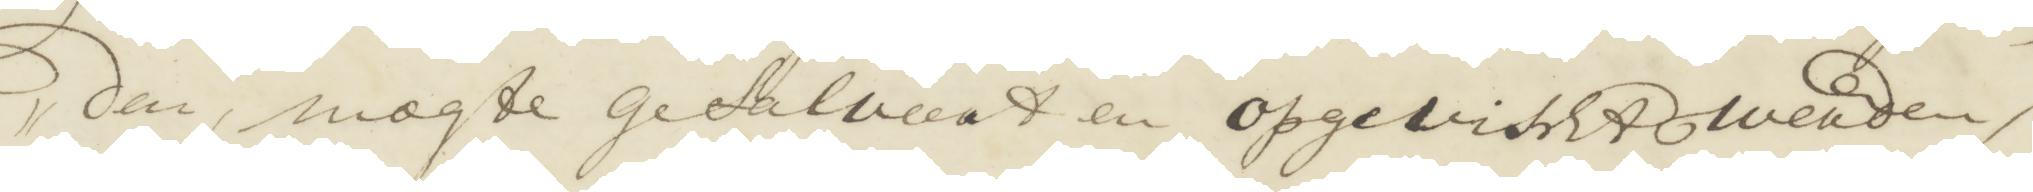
„den, mogte gesalveert en opgevischt werden,
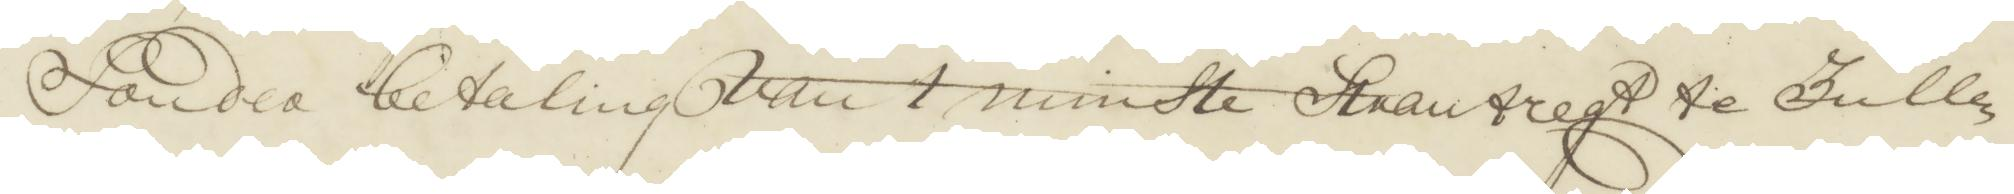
sonder betaling van 't minste strantregt te zullen
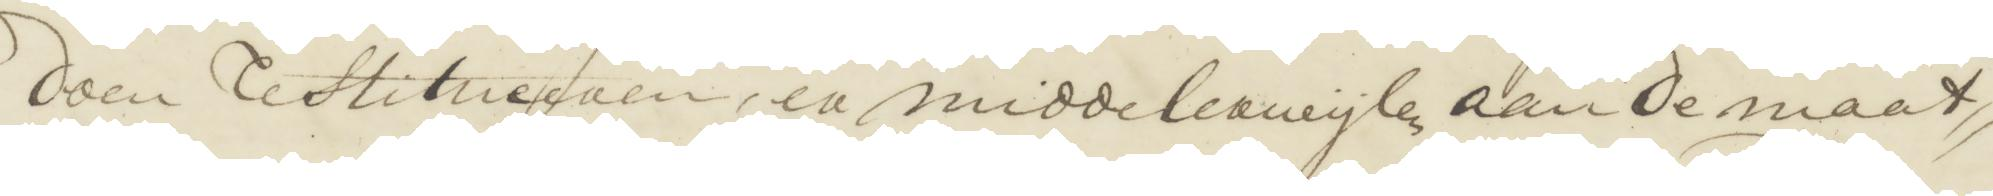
doen restitueeren, er middelerwijlen aan de maat„
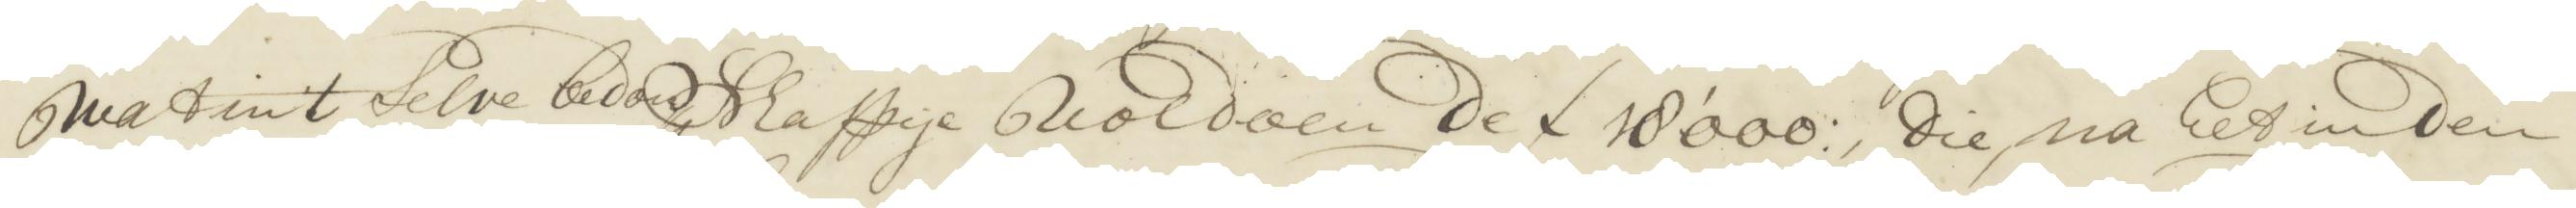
wat in ’t selve bedon schappije voldoen de ƒ 18'000:, die, na het in den
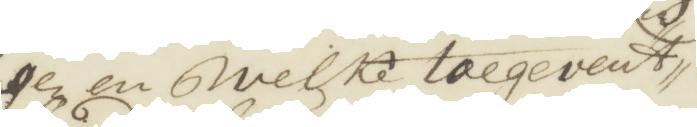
gen en welke toegevent„
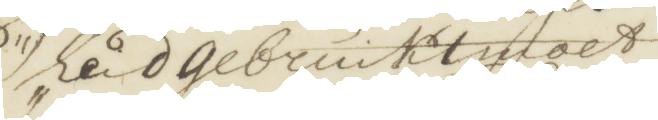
„heid gebruikt moet
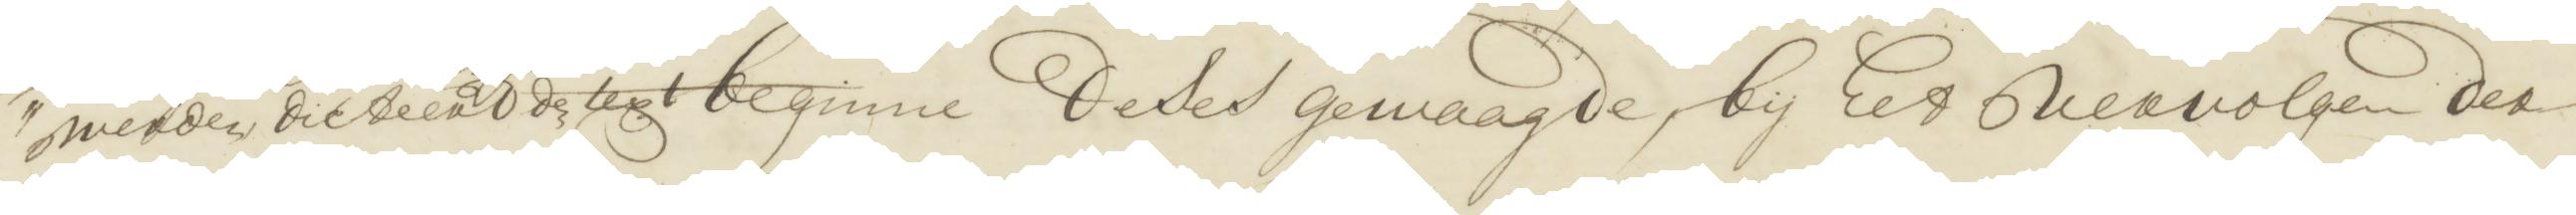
werden, dicteerd den text beginne deses gewaagde, bij het vervolgen der
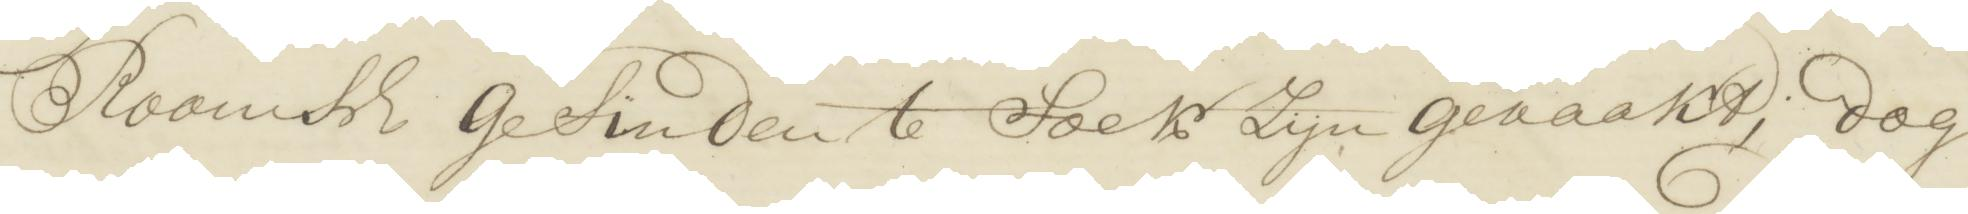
Roomsch gesinden te soek zijn geraakt, dog
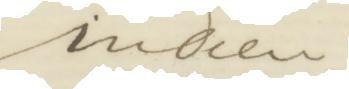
indien
